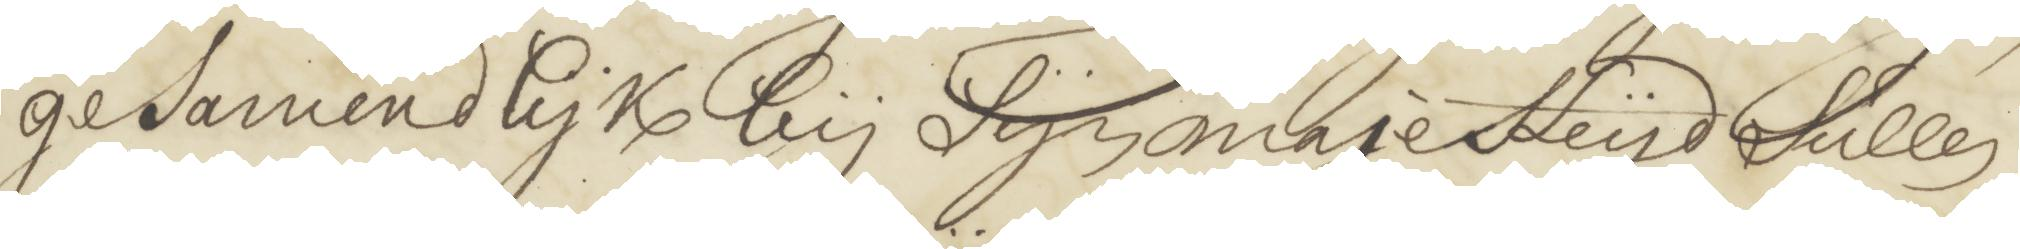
gesamendlijk bij Sijn majesteijd Sullen
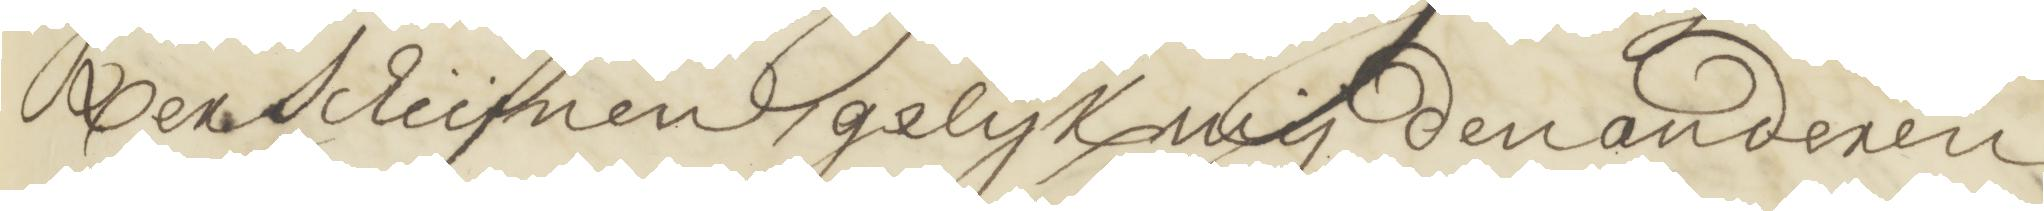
verscheijnen, gelijk wij den anderen
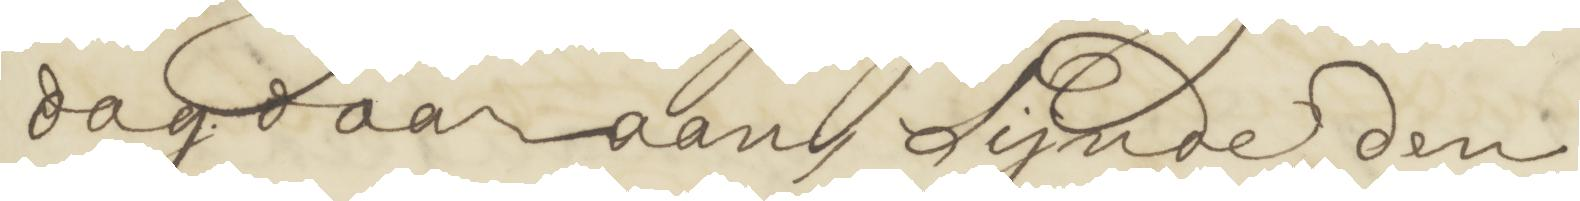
dag daar aan, Sijnde den
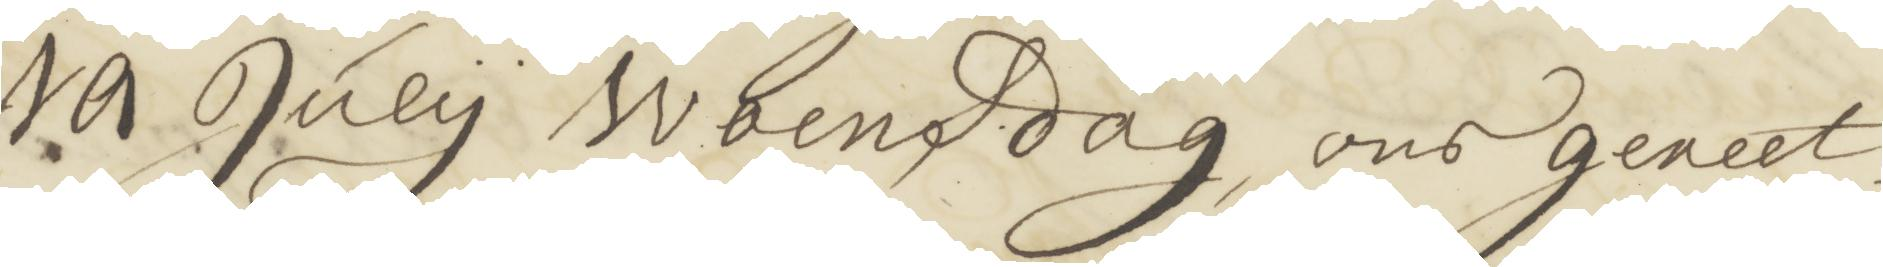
14 Julij woensdag, ons gereet
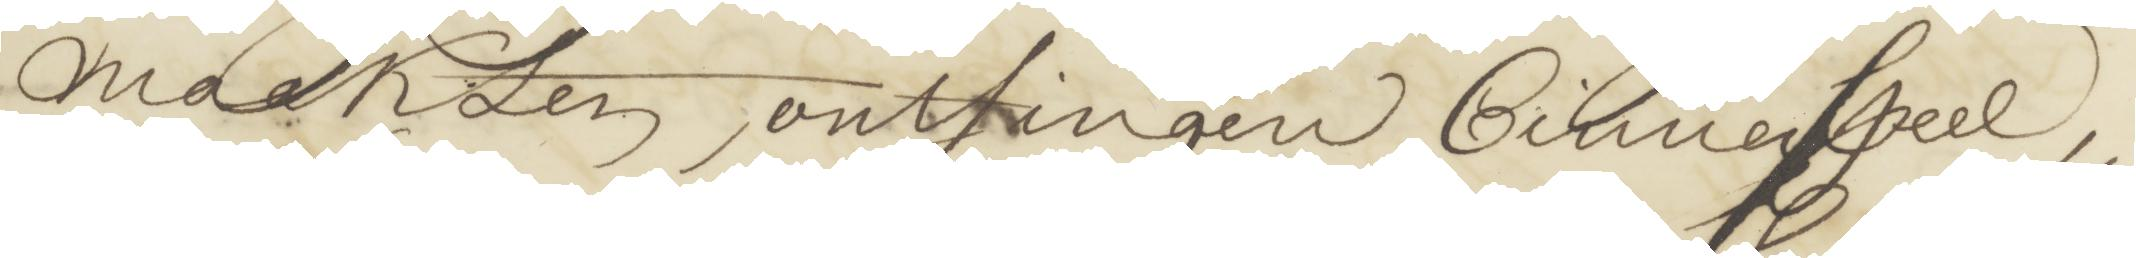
maakten, ontfingen binnen Speel„
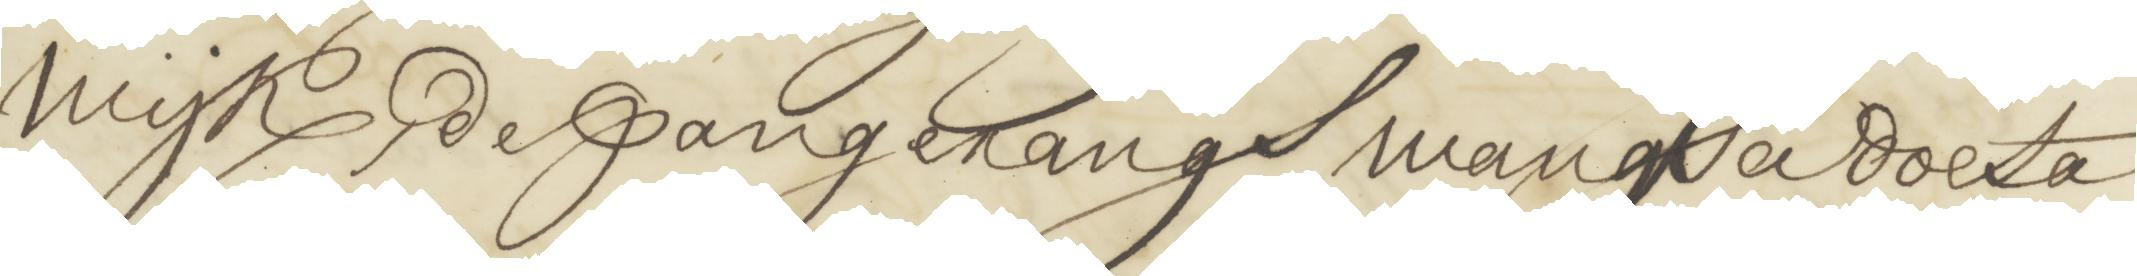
wijk, de pangerangs mangsa doeta
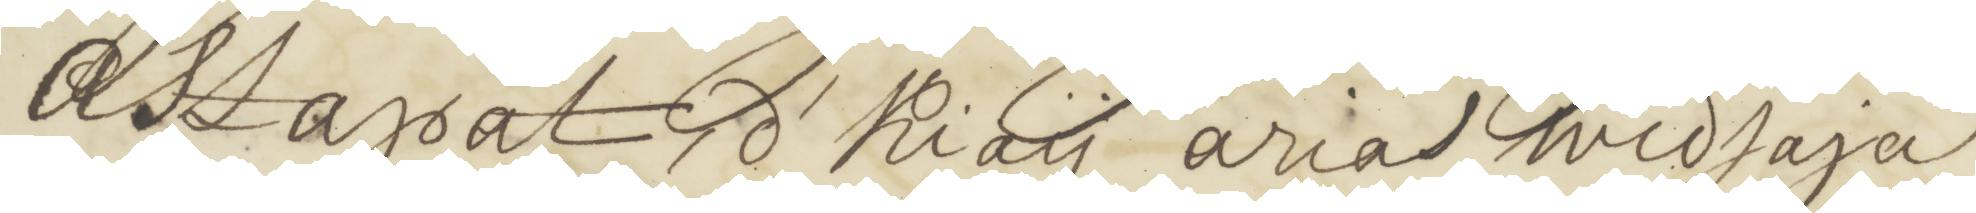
astapat, d' kiaij arias widjaja
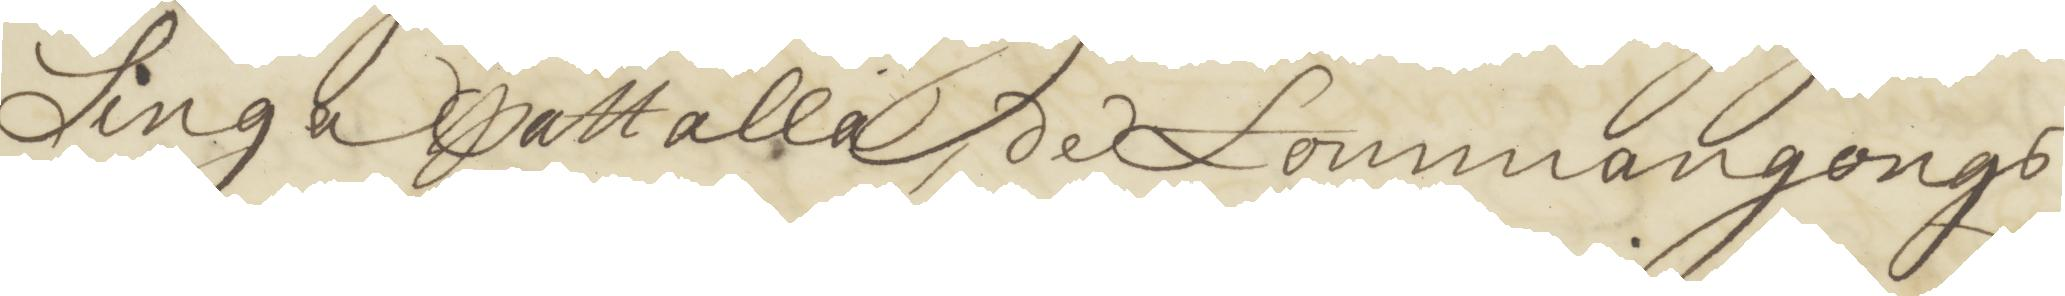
singa pattalla, de tommangongs
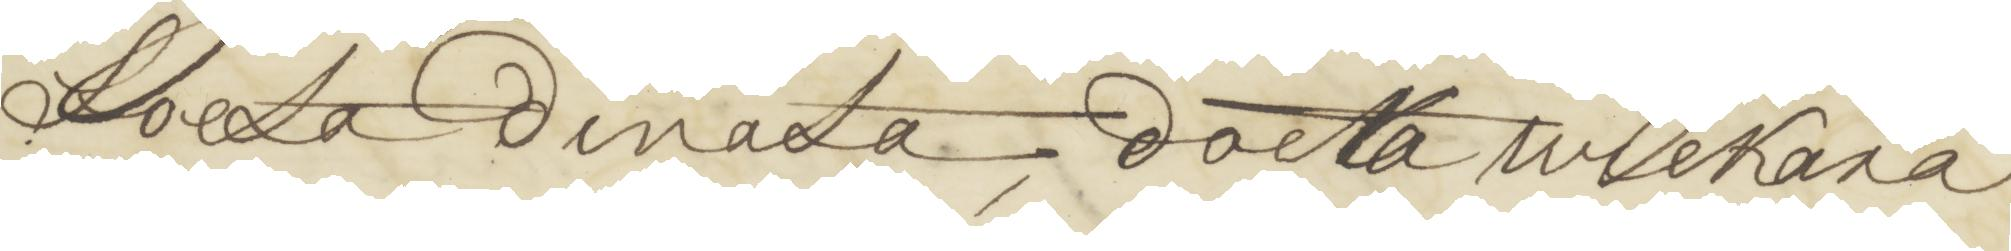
Soeta dinata, doeta wiekara
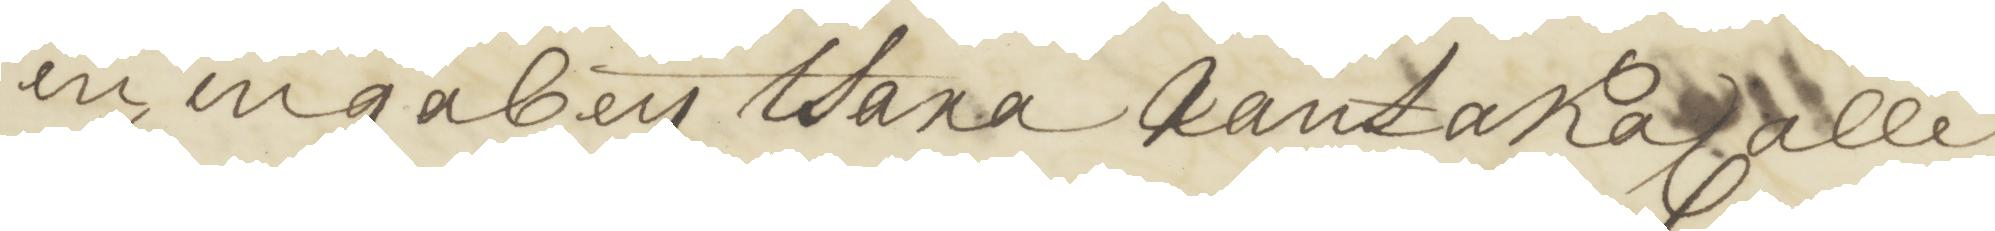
en ingabeij tsara rantaka alle
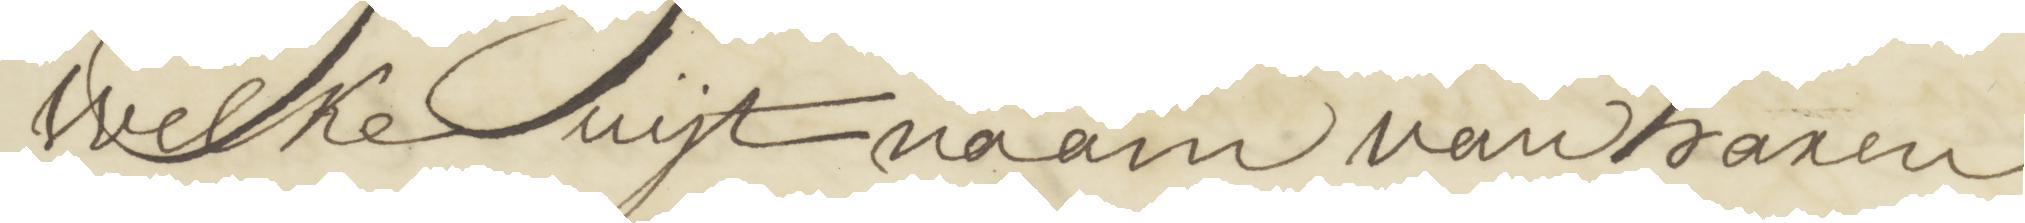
welke uijt naam van haren
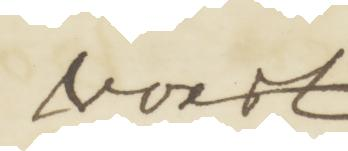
vorst
